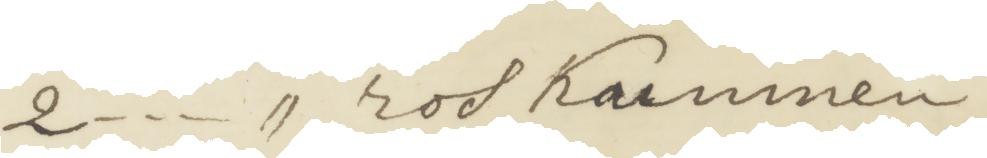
2 — - - „ ros kammen
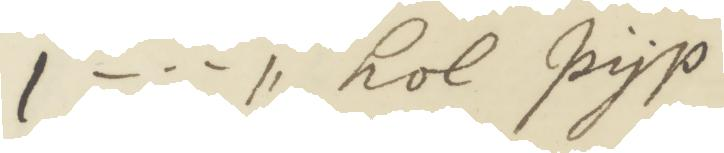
1 — - - „ hol pijp
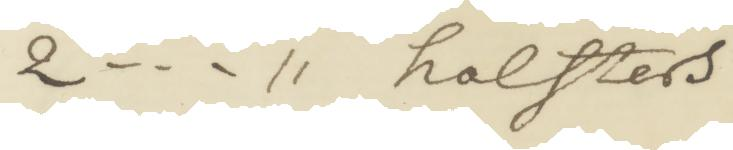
2 —. — „ halsters
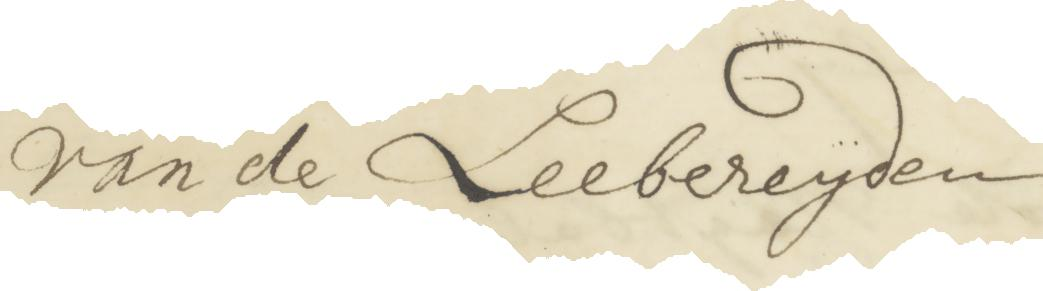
van de Leebereijden
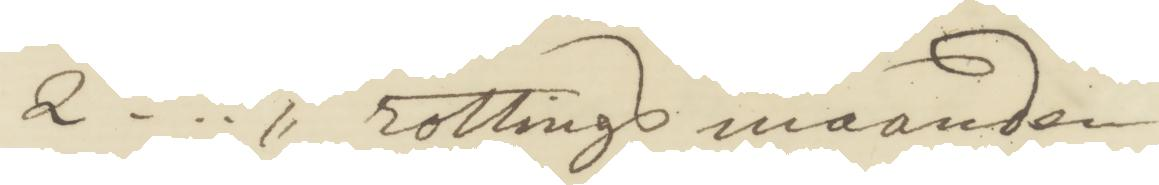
2 — - - „ rottings maanden
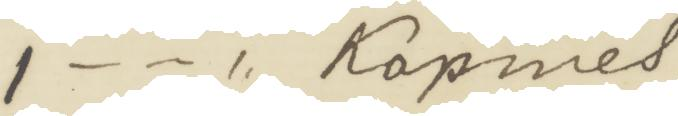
1 — — „ kapmes
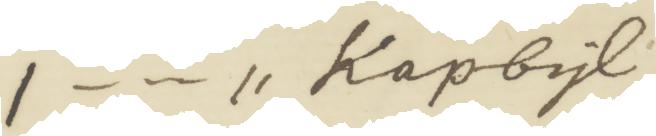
1 — — „ kapbijl
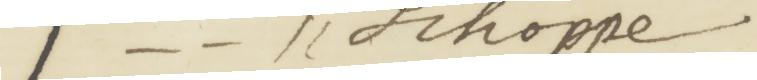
1 — — „ schoppe
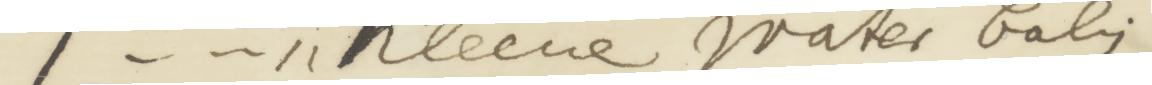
1 — — „ kleene water balij
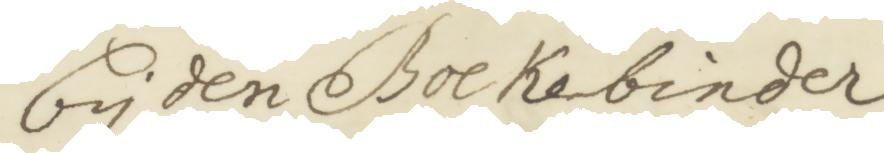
bij den Boekebinder
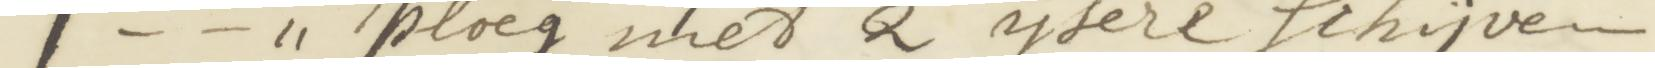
1 — — „ ploeg met 2 ijsere schijven
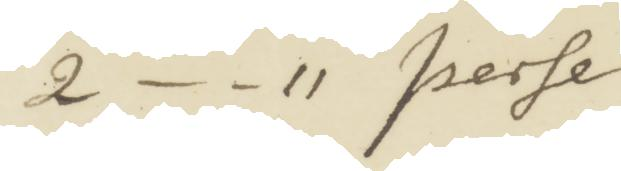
2 — — „ perse
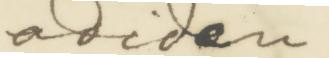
adiden
